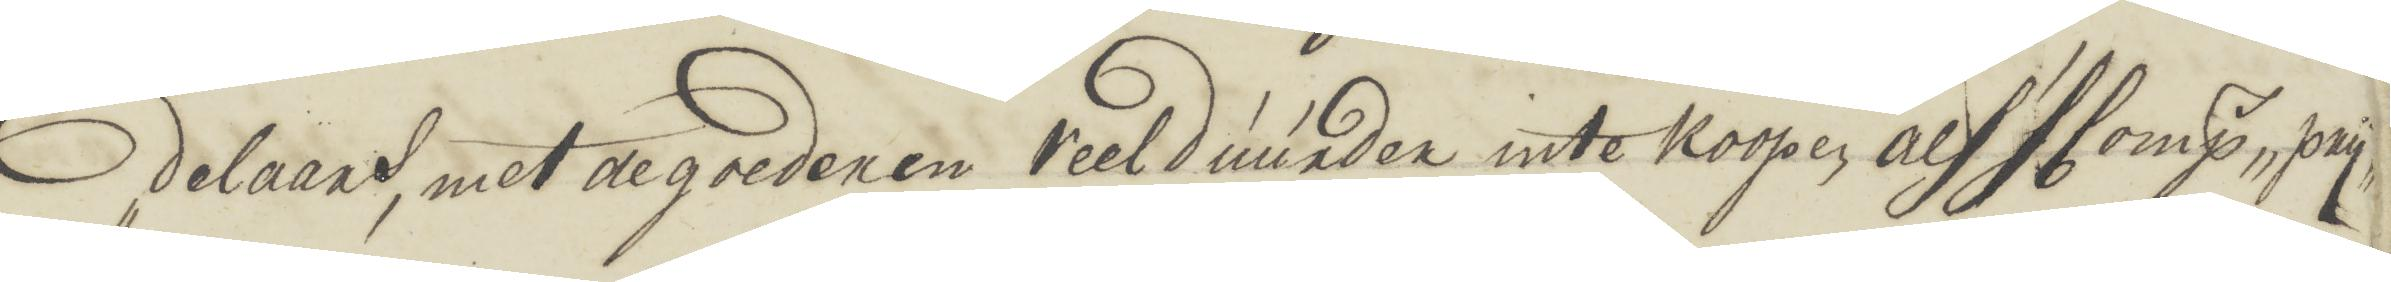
„delaars, met de goederen veel duurder inte koopen als 'sComp„s prij„
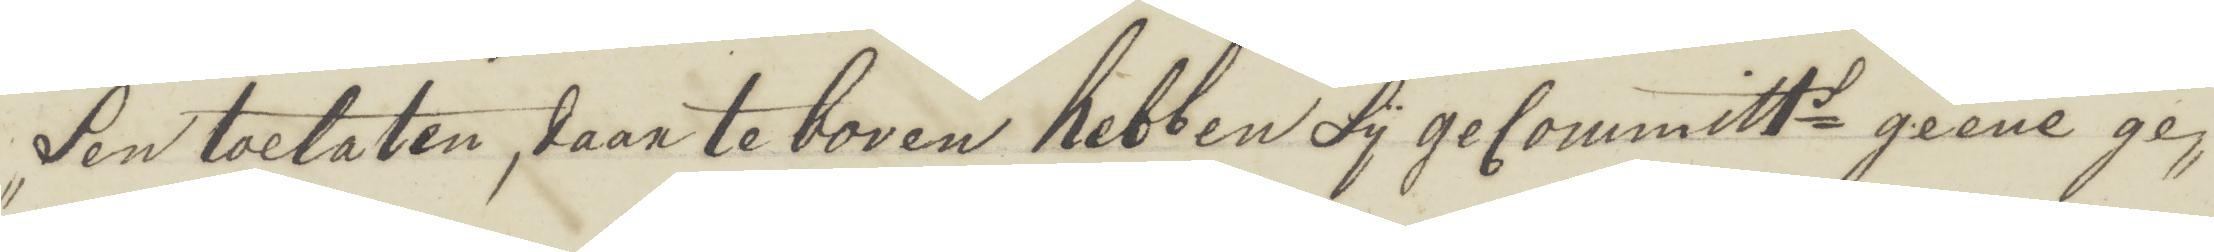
„sen toelaten, daar te boven hebben sij gecommitt=s geene ge„
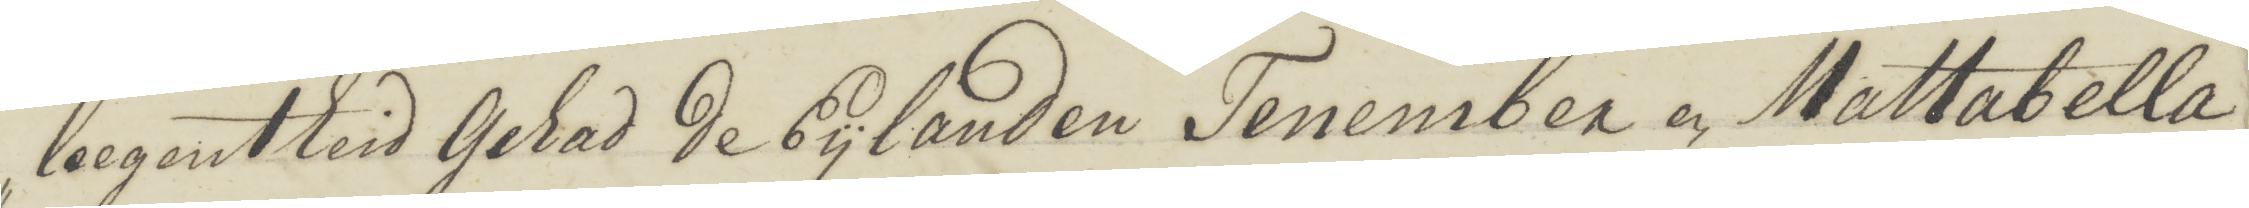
leegentheid gehad de Eijlanden Tenember en Mattabella
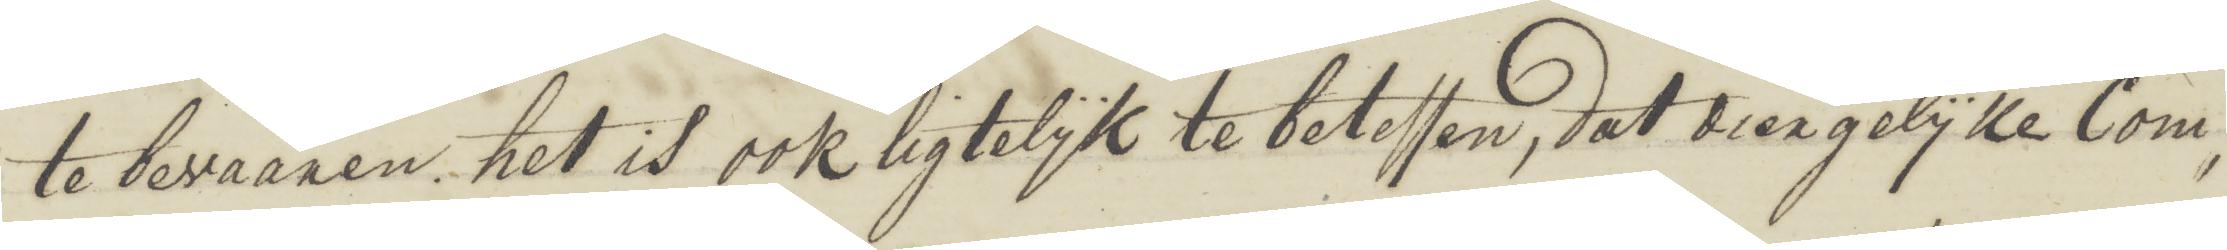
te bevaaren, het is ook ligtelijk te beseffen, dat diergelijke com
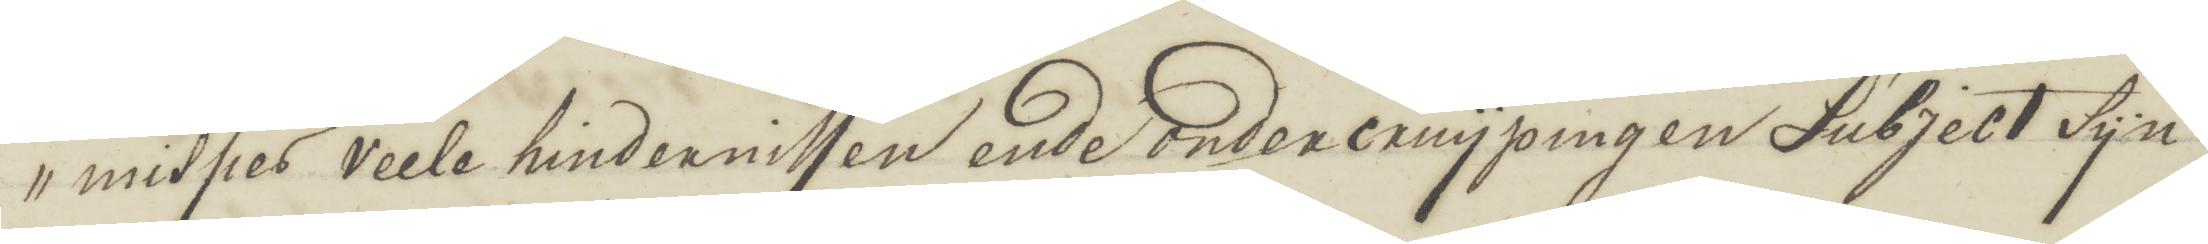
„missies veele hindernissen ende ondercruijpingen subject sijn
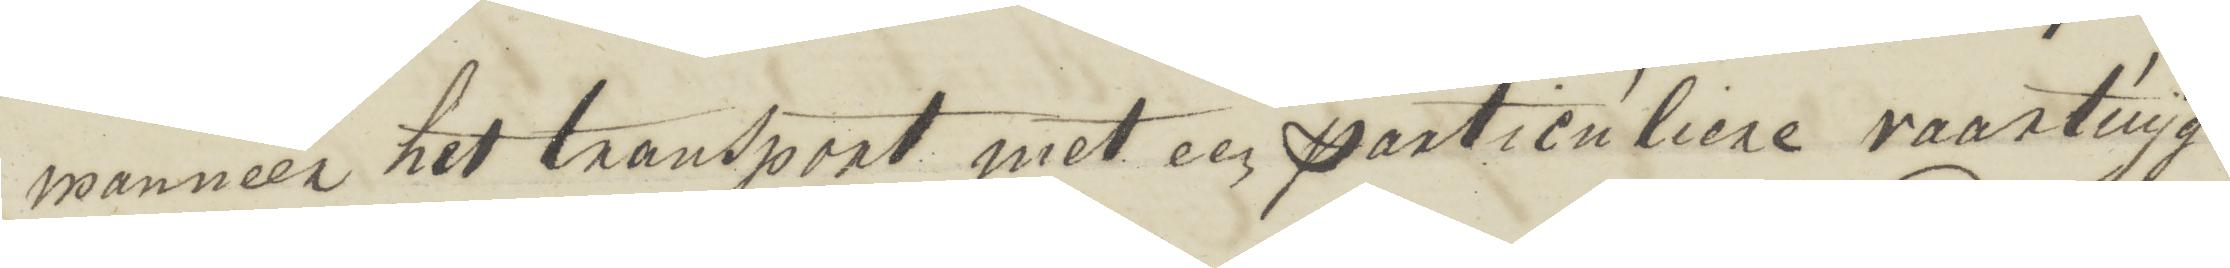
wanneer het transport met een particuliere vaartuijg
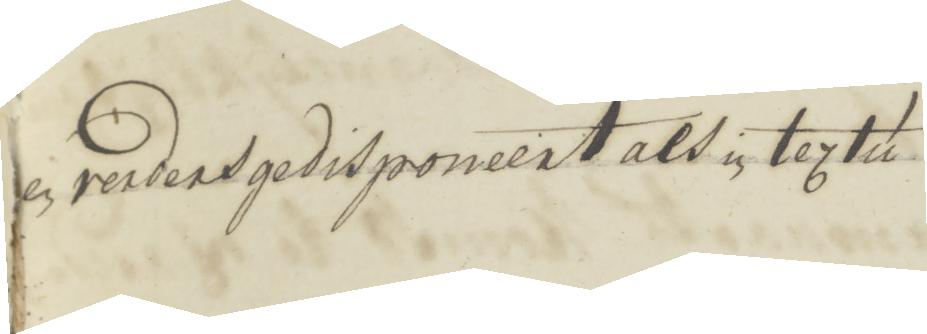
en verders gedisponeert als in textu
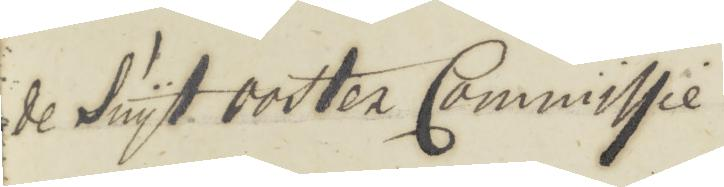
de suijt ooster Commissie
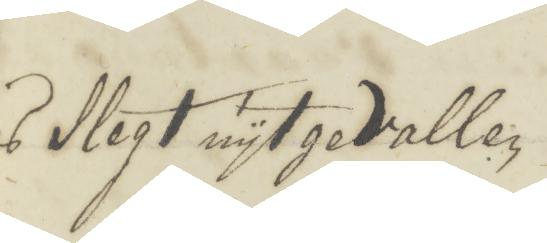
is slegt uijt gevallen
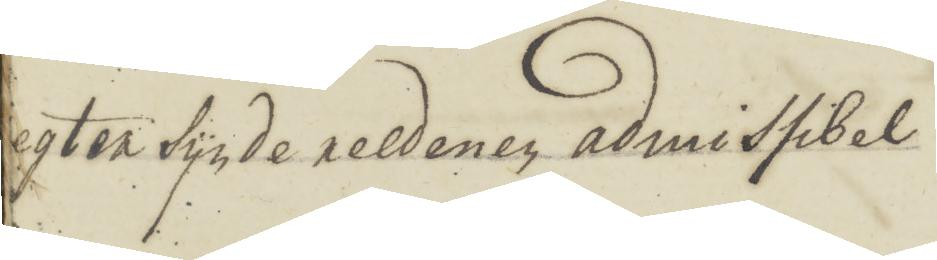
egter sijn de reldenen admissibel
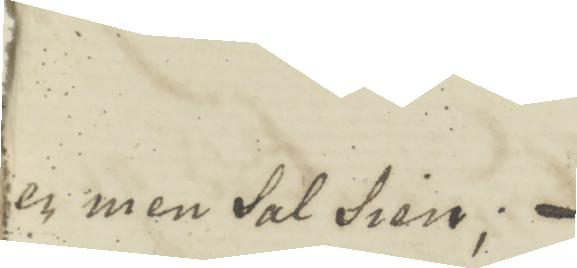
en men sal sien.
